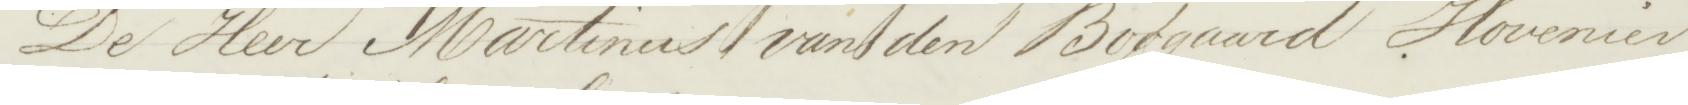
De Heer Martinus van den Boogaard Hovenier
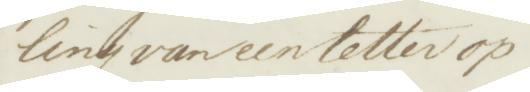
ling van een letter op
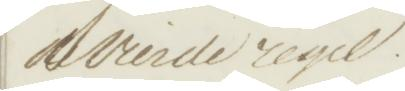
de vierde regel.
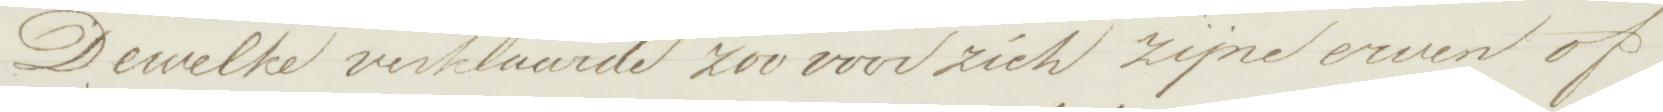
Dewelke verklaarde zoo voor zich zijne erven of
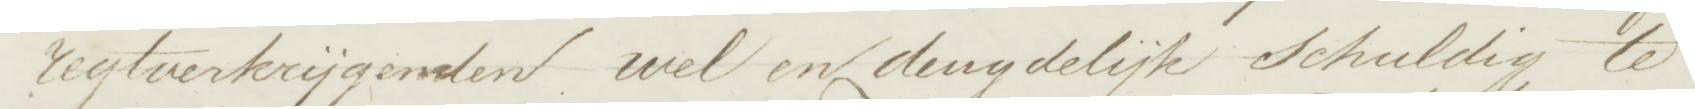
regtverkrijgenden wel en deugdelijk schuldig te
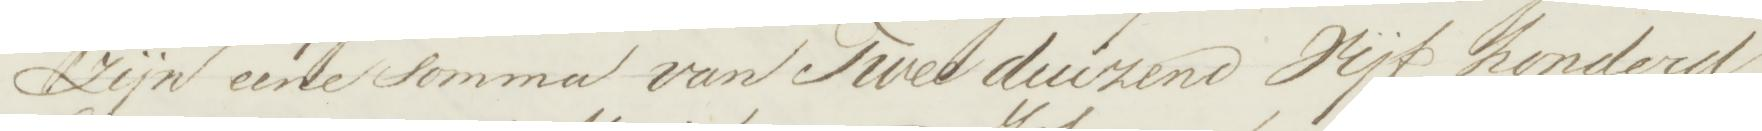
zijn eene somma van Twee duizend Vijf honderd
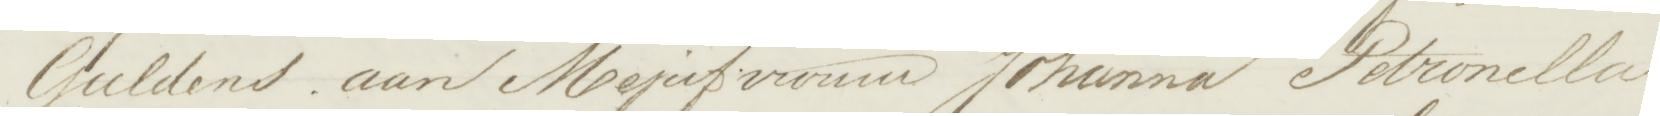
Guldens. aan Mejufvrouw Johanna Petronella
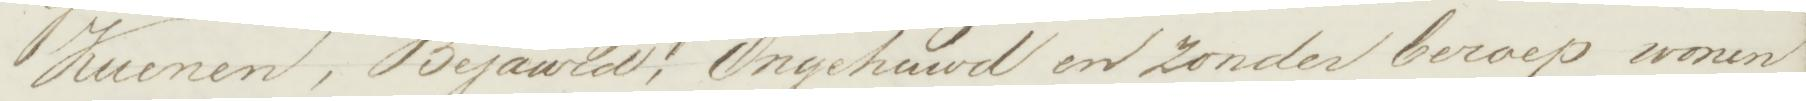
Kuenen, Bejaard, Ongehuwd en zonder beroep wonen
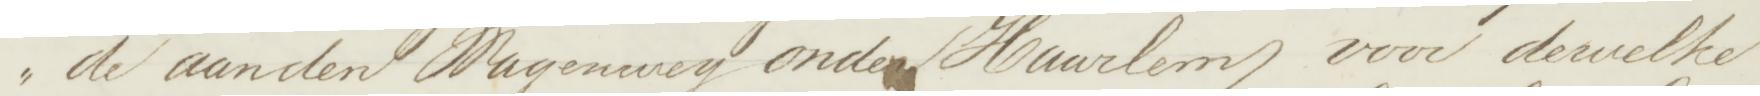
„de aan den Wagenweg onder Haarlem voor dewelke
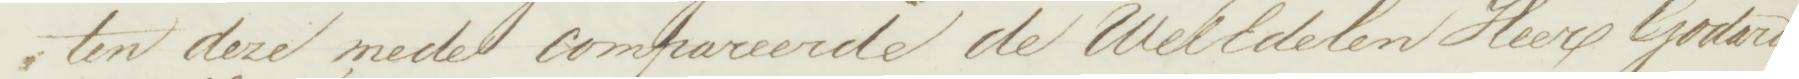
„ten deze mede compareerde de Wel Edelen Heer Godard
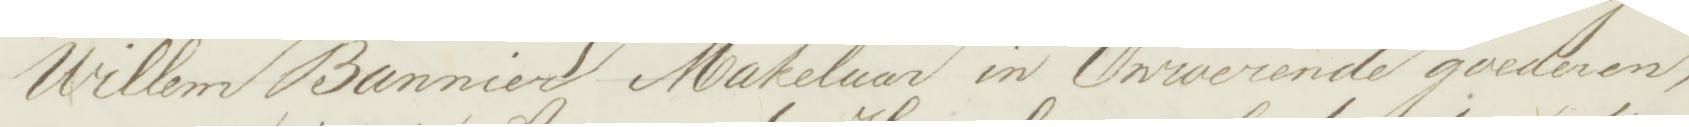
Willem Bannier Makelaar in Onroerende goederen
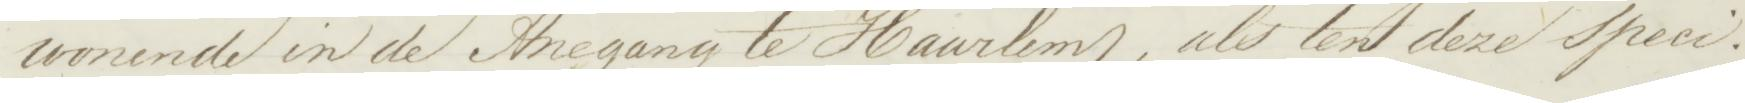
wonende in de Anegang te Haarlem, als ten deze speci„
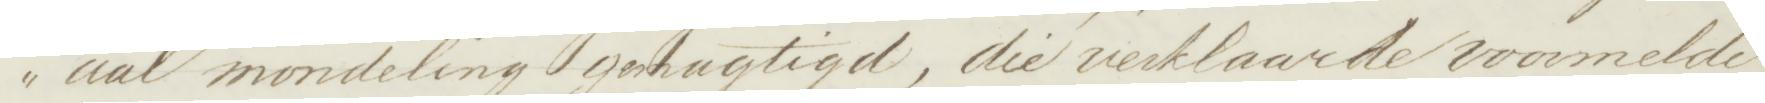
„aal mondeling gemagtigd die verklaarde voormelde
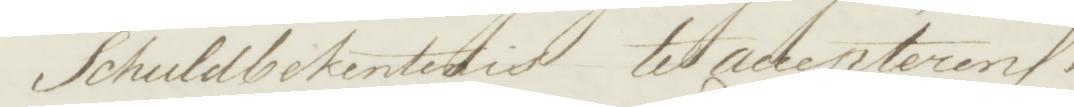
Schuldbekentenis te acepteren.
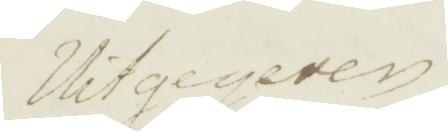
Uitgegeven
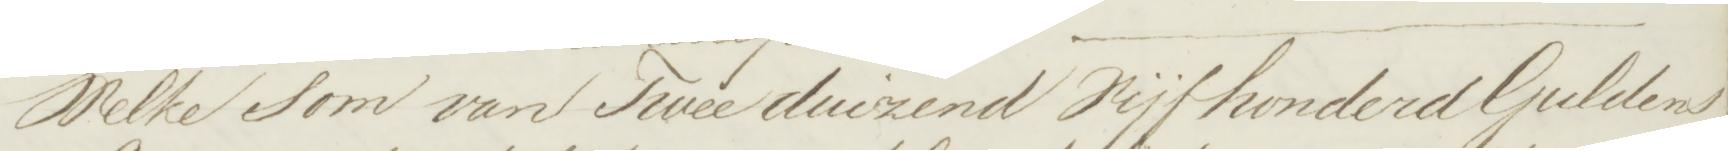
Welke som van Twee duizend Vijf honderd Guldens
